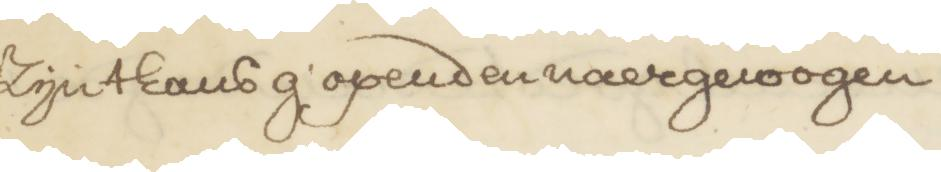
zijn thans g’opend en naergewogen
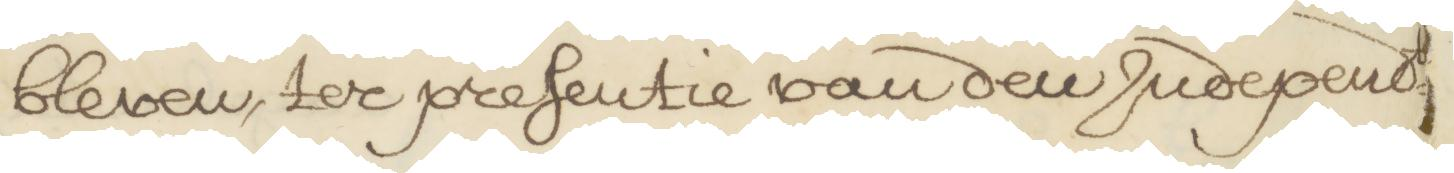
bleven, ter presentie van den Jndepend=t
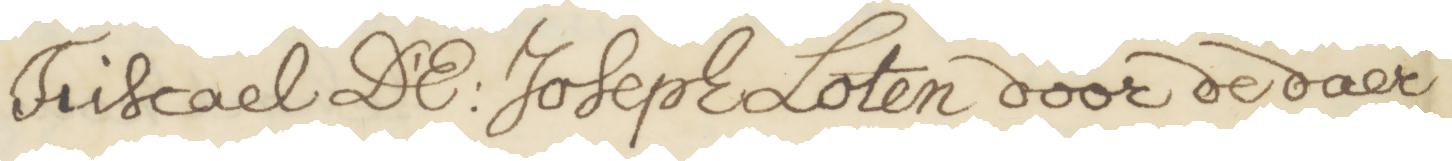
Fiscael D'E: Joseph Loten door de daer
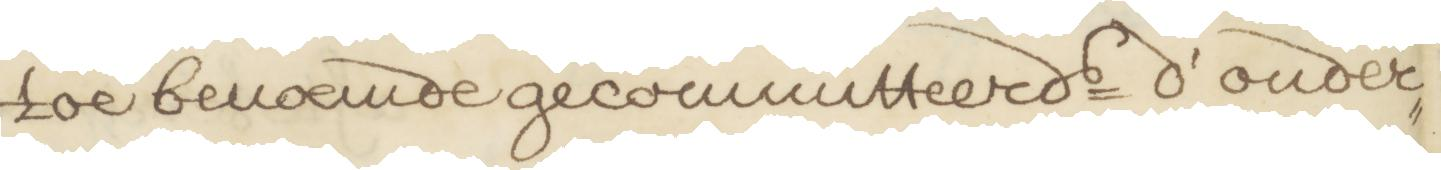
toe benoemde gecommitteerd =e d’ onder„
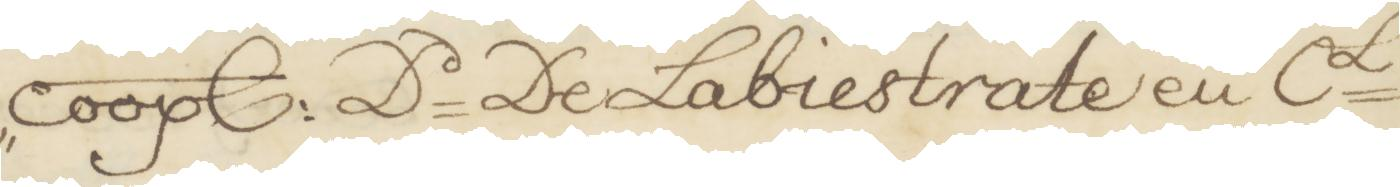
"coopl: D=d De Labiestrate en C=L
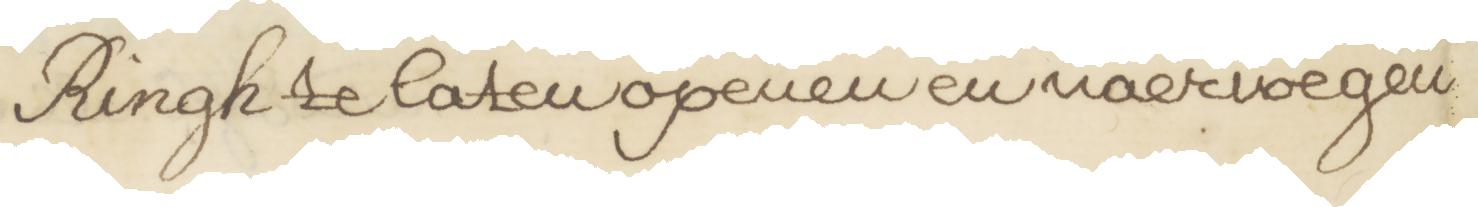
Ringh te laten openen en naerwegen
